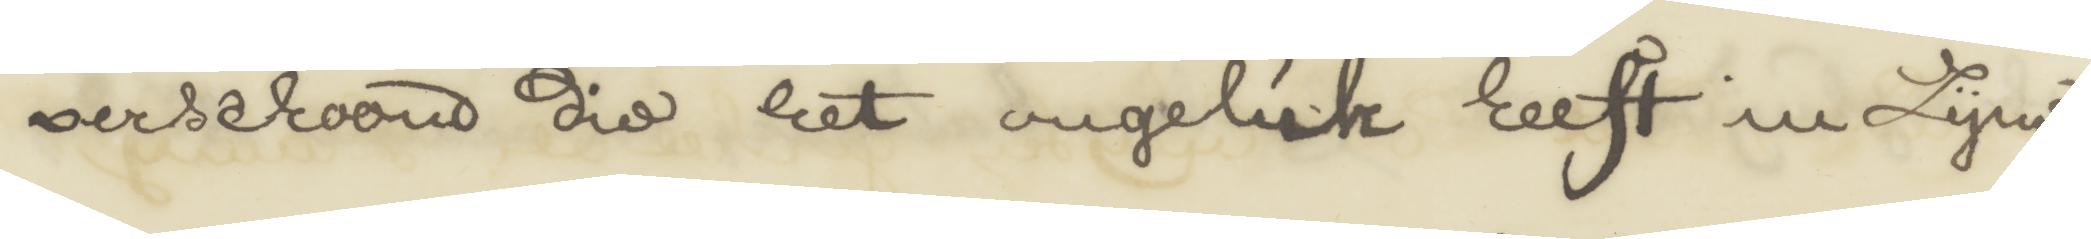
verschoond die het ongeluk heeft in zijne
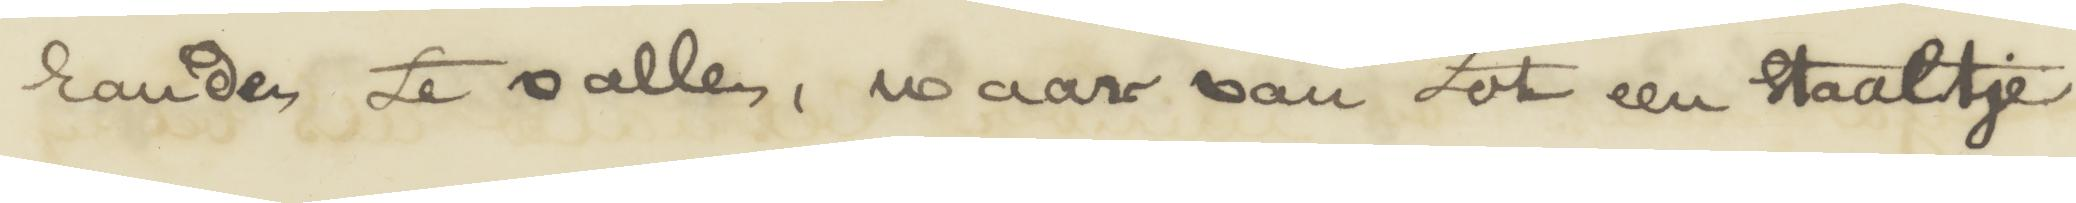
handen te vallen, waar van tot een staaltje
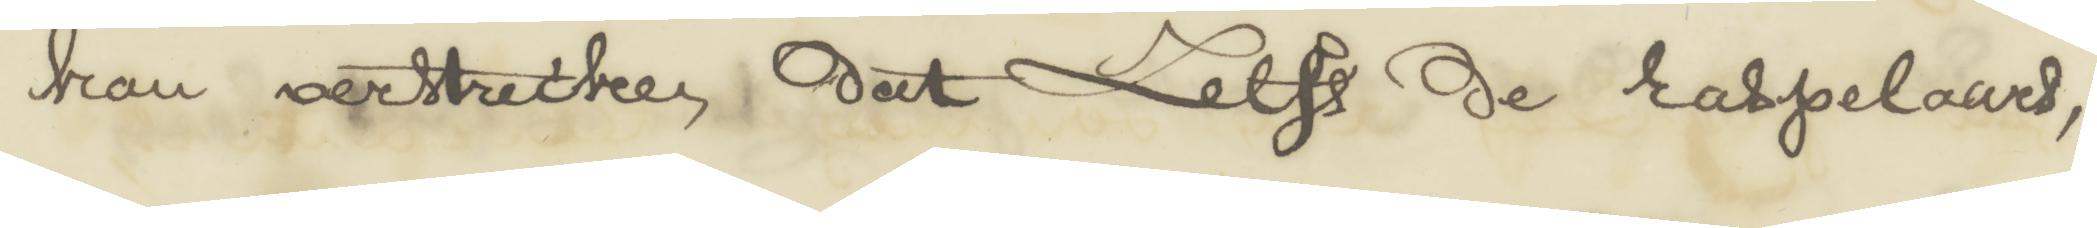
kan verstrecken dat zelfs de haspelaars,
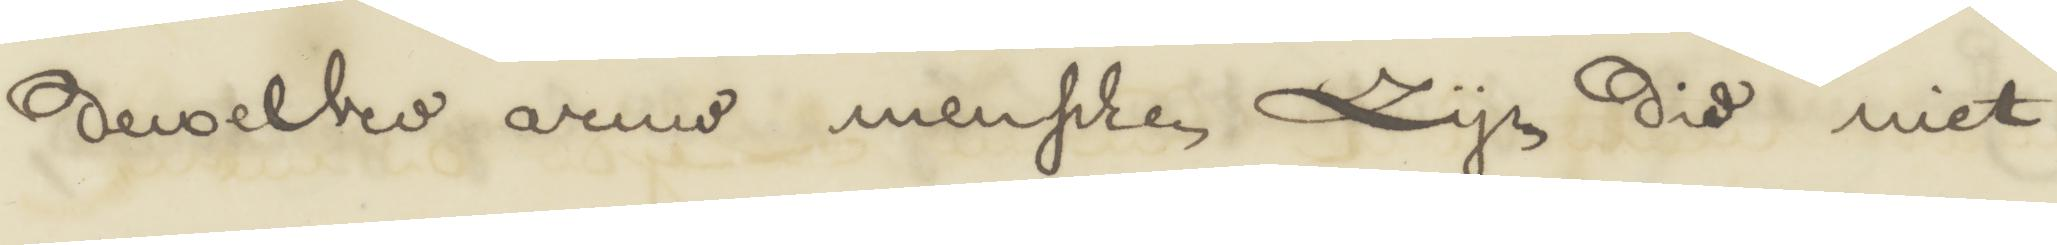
dewelke arme menschen zijn die niet
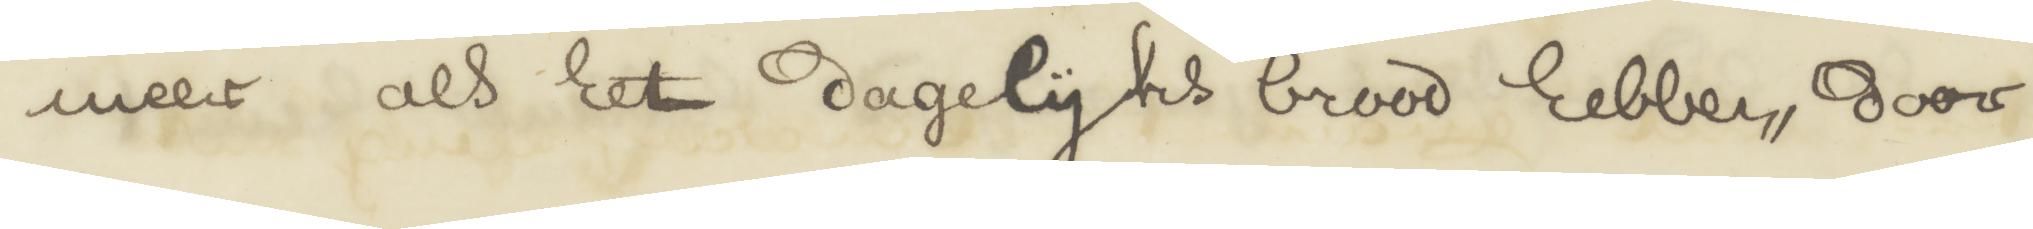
meer als het dagelijks brood hebben, door
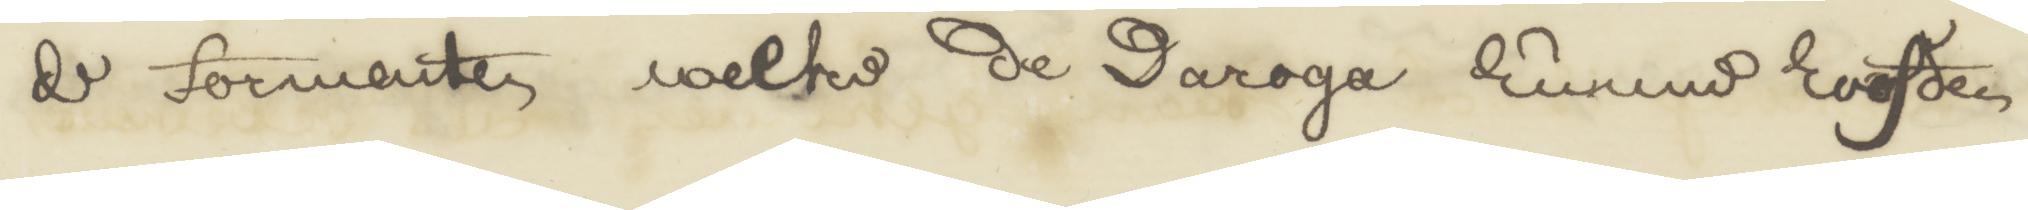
de formenten welke de Daroga hunne hoofden
